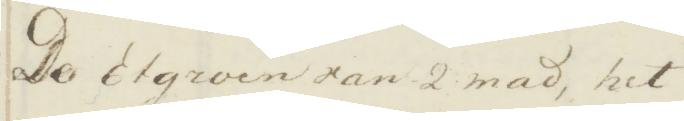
De Etgroen van 2 mad, het
